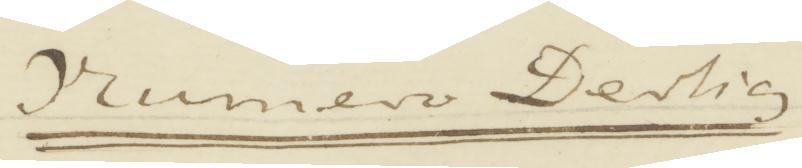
Numero Dertig
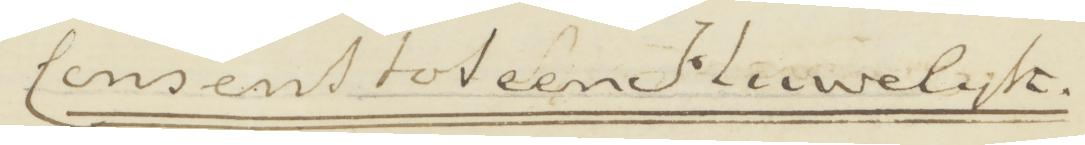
Consent tot een Huwelijk.
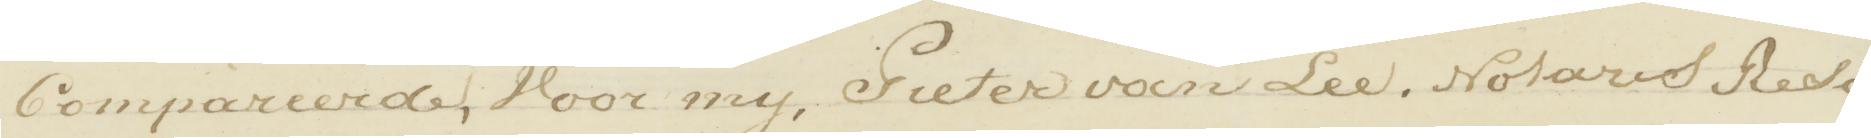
Compareerde, Voor my, Pieter van Lee, Notaris Resi
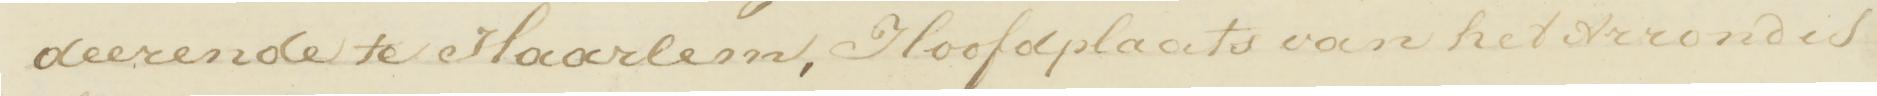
deerende te Haarlem, Hoofdplaats van het Arrondis
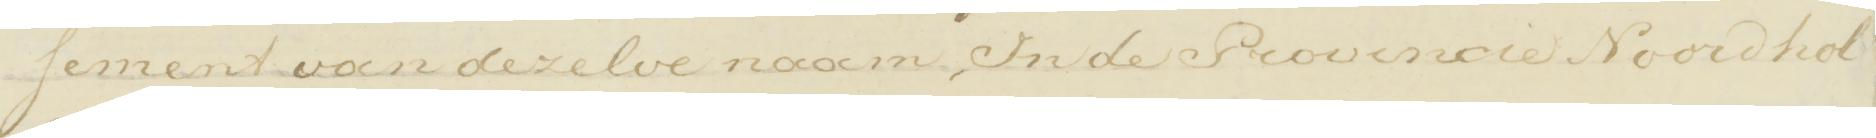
sement van dezelve naam, In de Provincie Noordhol
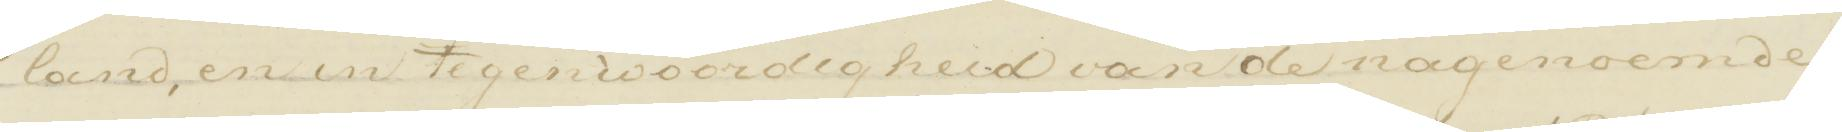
land, en in tegenwoordigheid van de nagenoemde
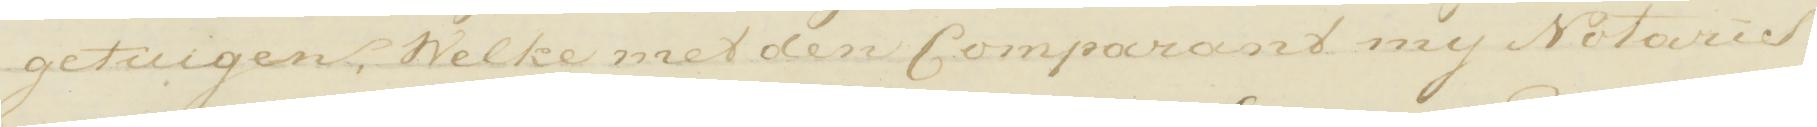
getuigen, welke met den Comparant my Notaris
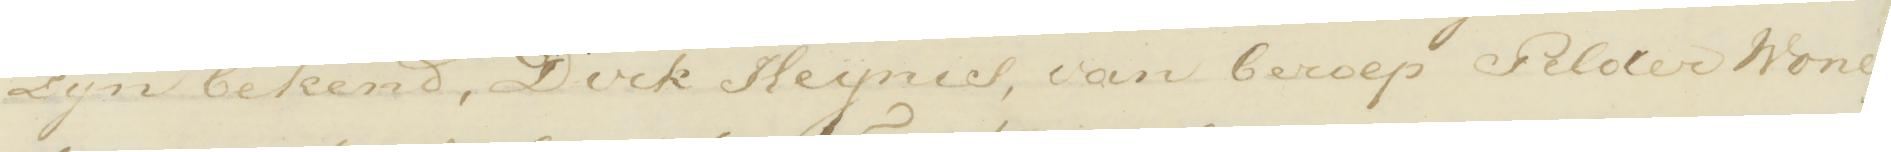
zyn bekend, Dirk Heynis, van beroep Pelder Wonen
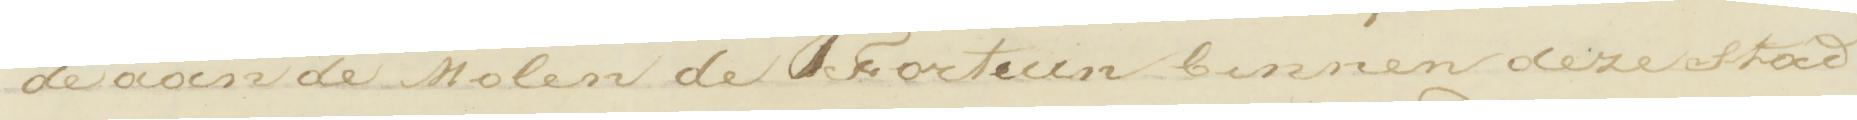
de aan de Molen de Fortuin binnen deze stad
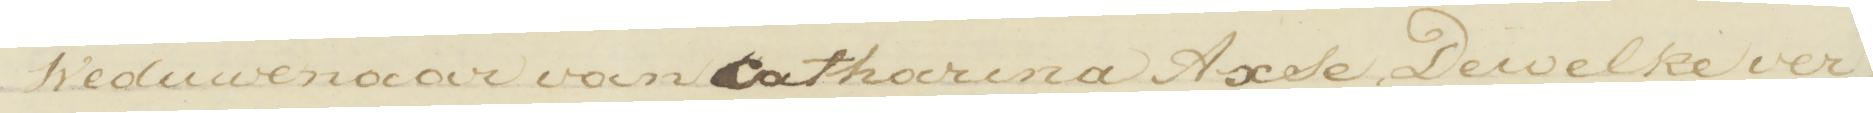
weduwenaar van Catharina Axse, Dewelke ver
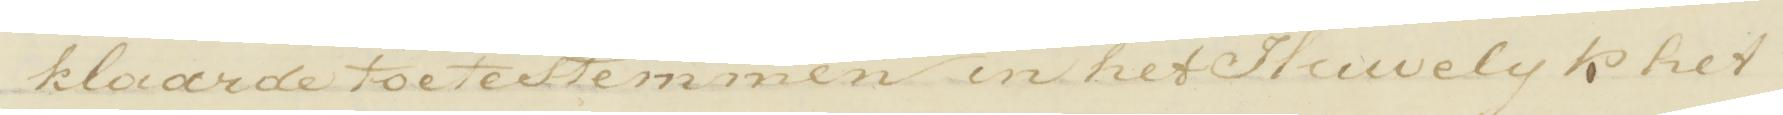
klaarde toetestemmen in het Huwelyk het
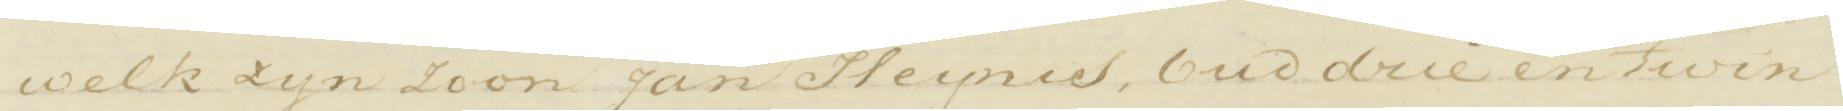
welk zyn zoon Jan Heynis, oud drie en twin
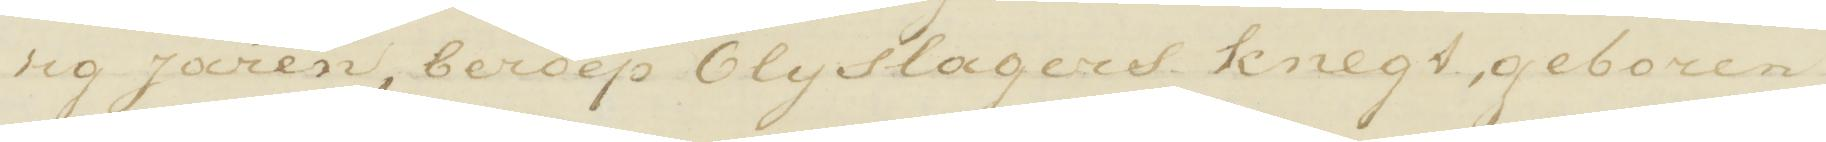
tig Jaren, beroep Olyslagers knegt, geboren
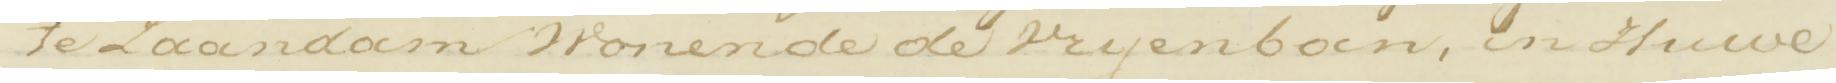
te Zaandam wonende de vryenban, in Huwe
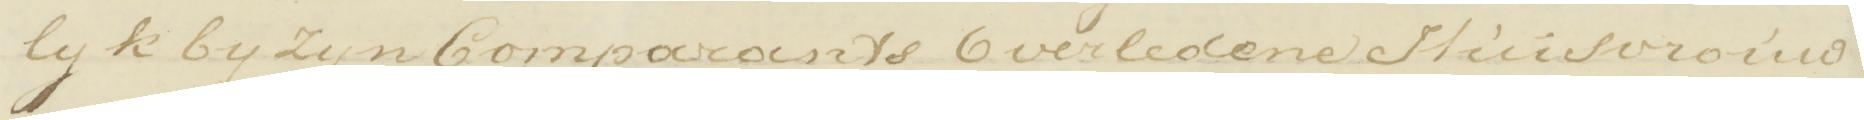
lyk by zyn Comparants overledene Huisvrouw
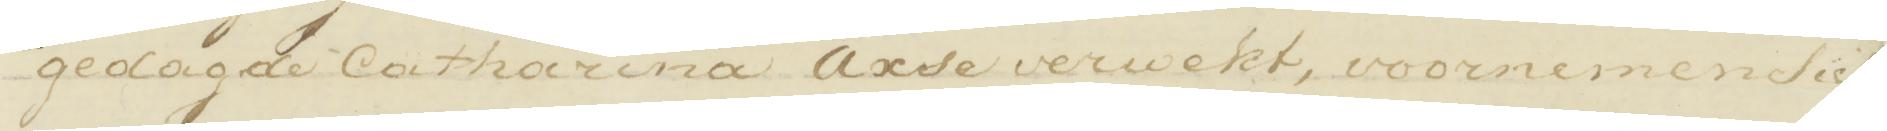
gedagde Catharina Axse verwekt, voornemens is
